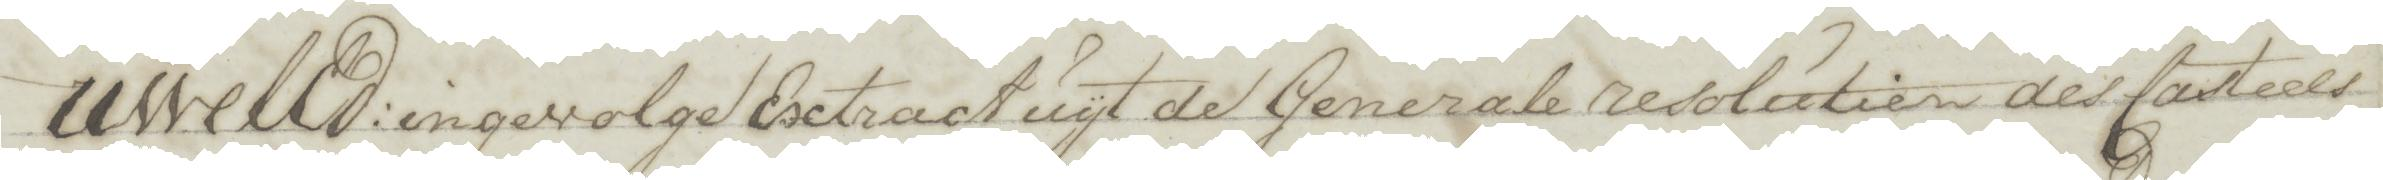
UWelEd: ingevolge Extract uijt de Generale resolutien des Casteels
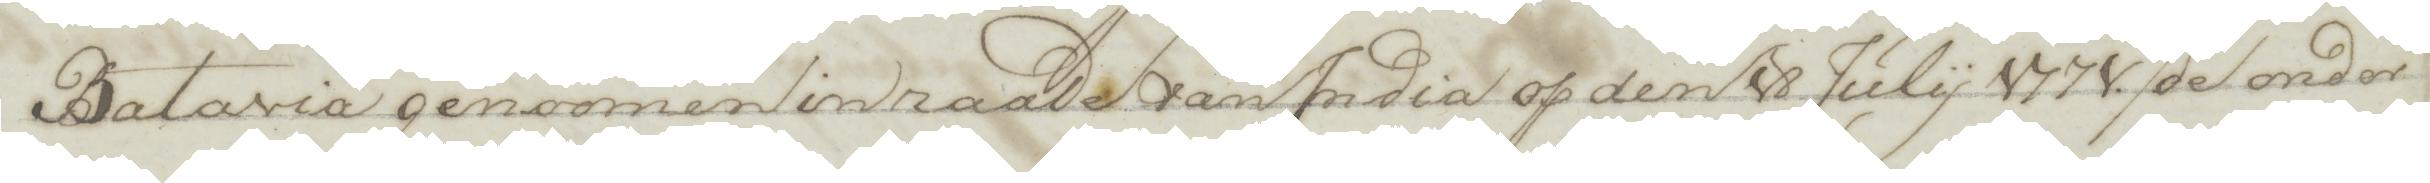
Batavia genoomen in raade van Jndia op den 18 Julij 1771./de onder
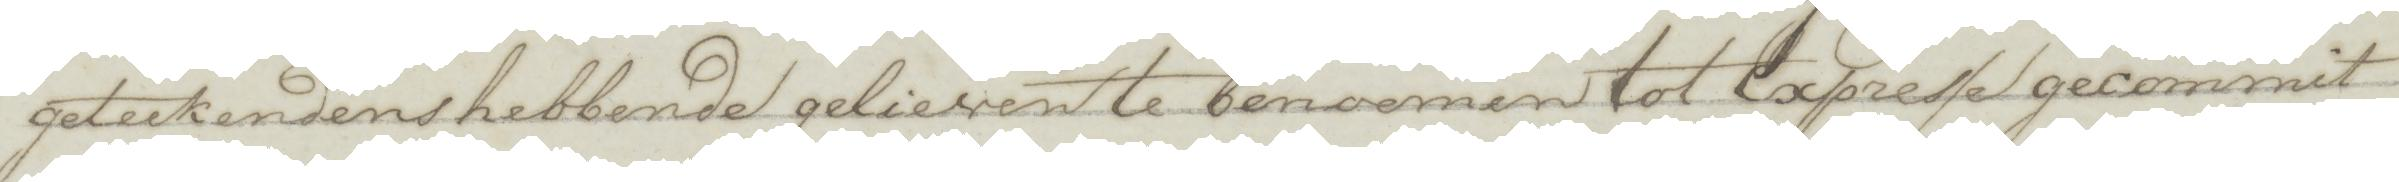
geteekendens hebbende gelieven te benoemen tot Expresse gecommit
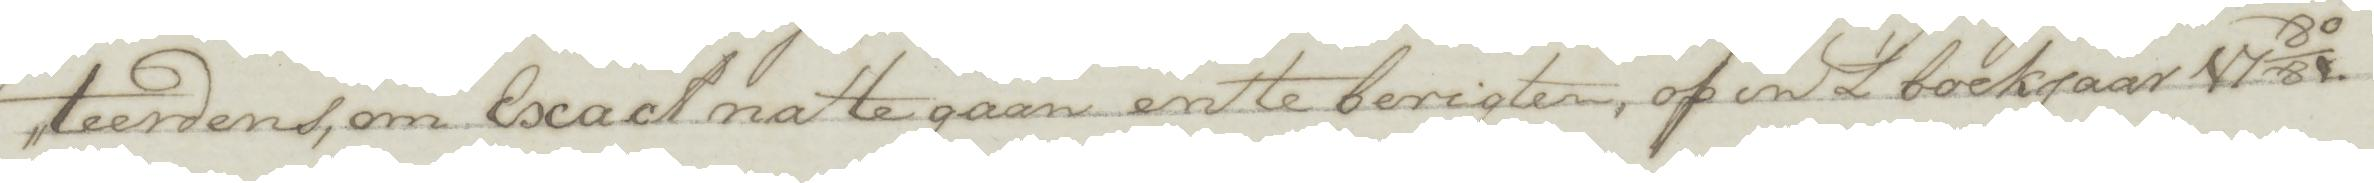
„teerdens, om Exact na te gaan en te berigten, of in 't boekjaar 17 80/81.
